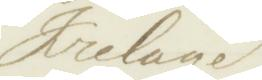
Krelage
